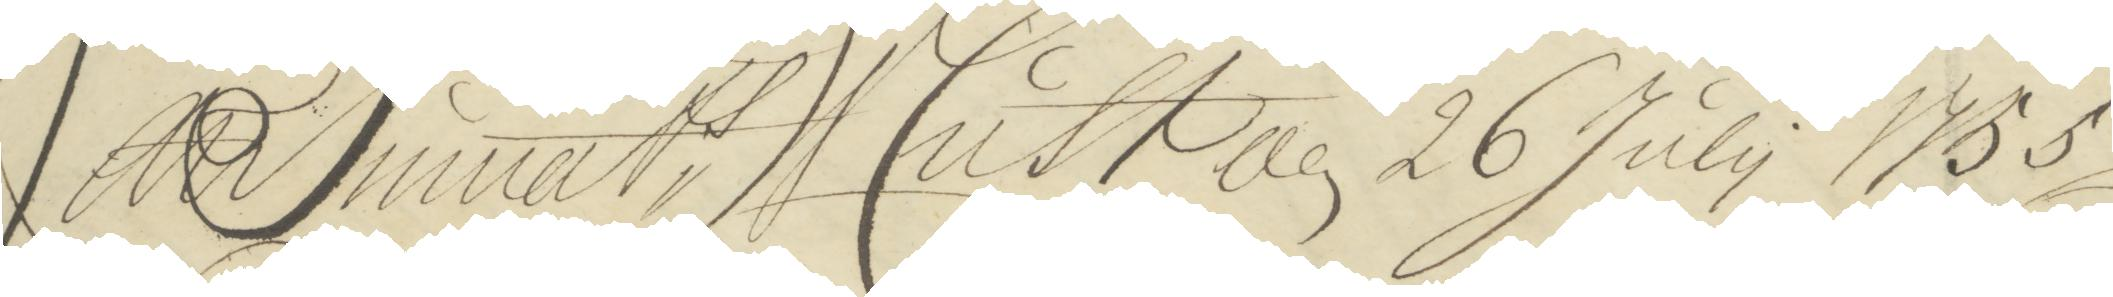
Van Sumat„s W Cust den 26 Julij 1755
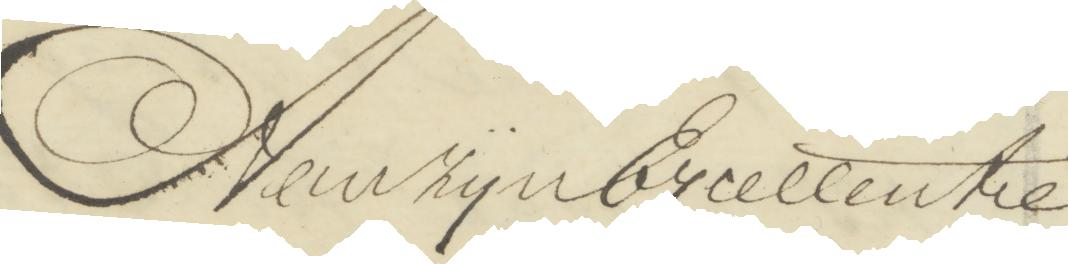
Aen zijn Excellentie
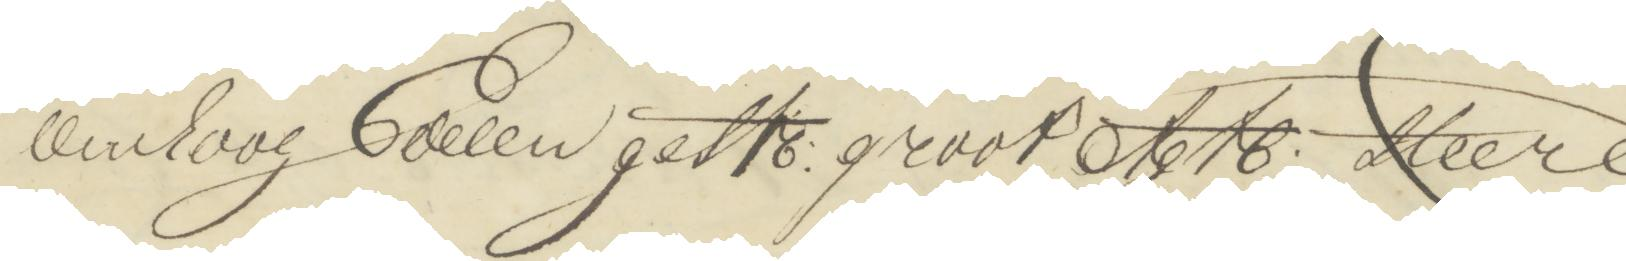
den hoog Edelen gestr: groot Agtb: Heere
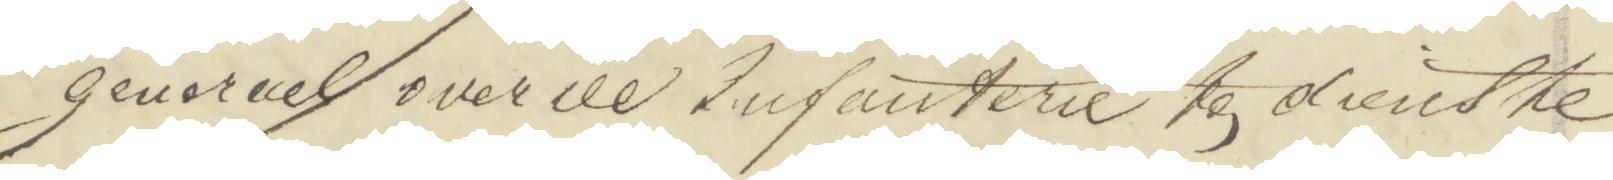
generael over de Infanterie ten dienste
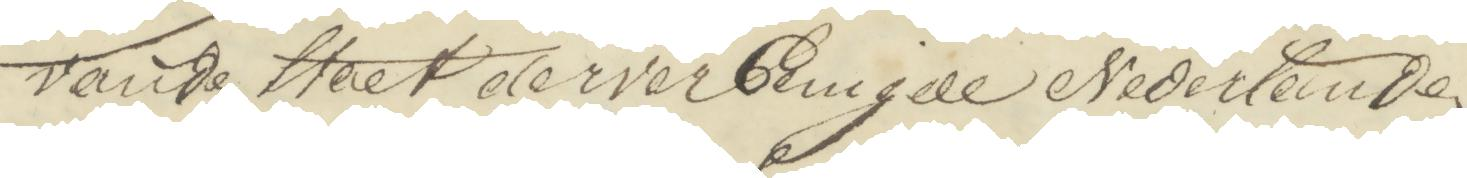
vanden staet der verEenigde Nederlanden
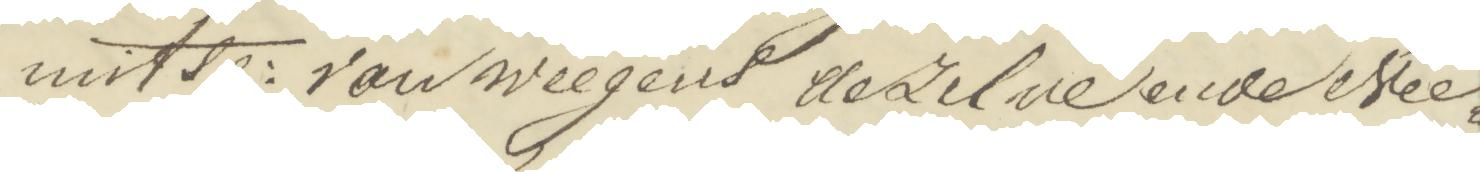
mitsg: van weegens dezelve ende Nee„
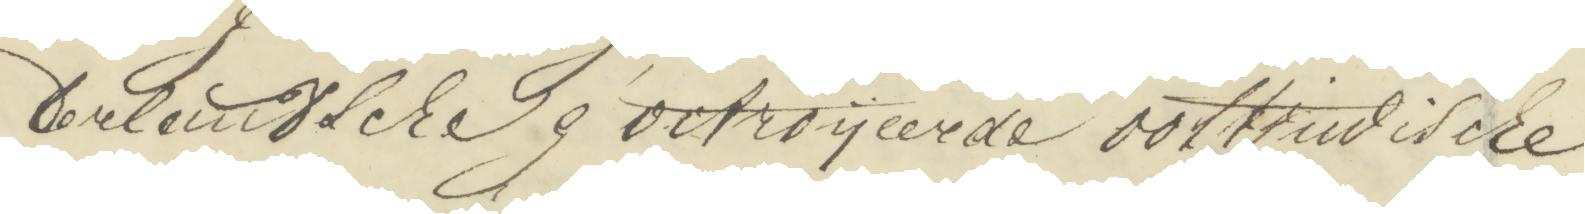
derlandssche g’octroijeerde oostjndische
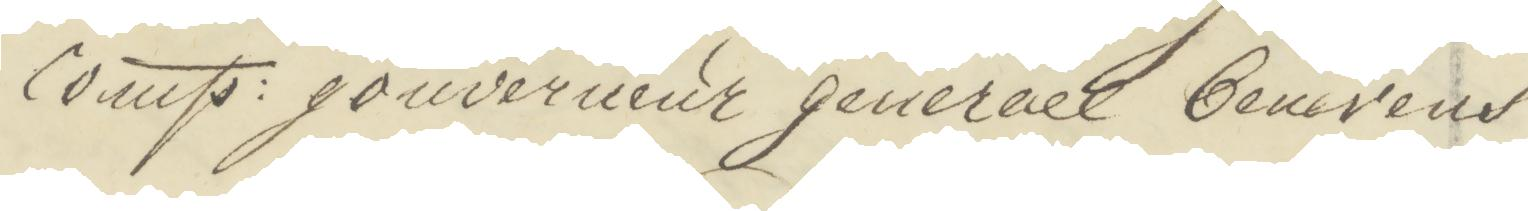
Comp: gouverneur generael benevens
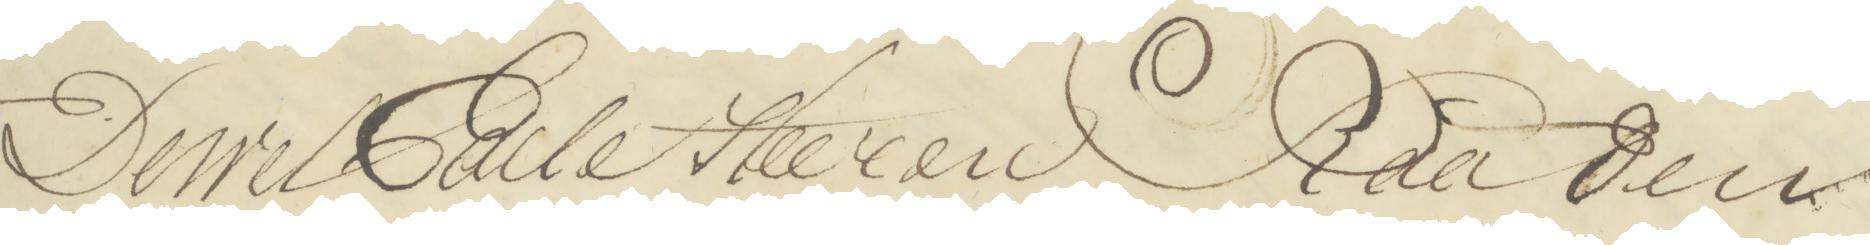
DewelEdele Heeren Raaden
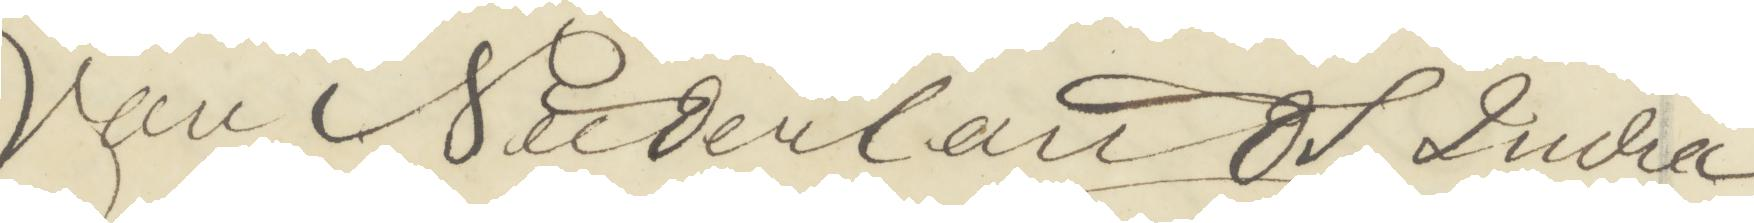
van Neederlands India
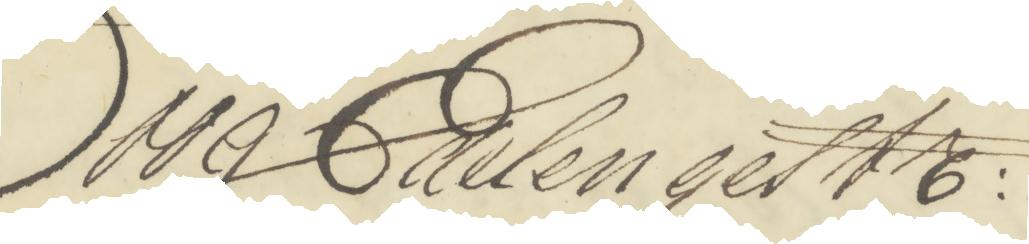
Hoog Edelen gestr:
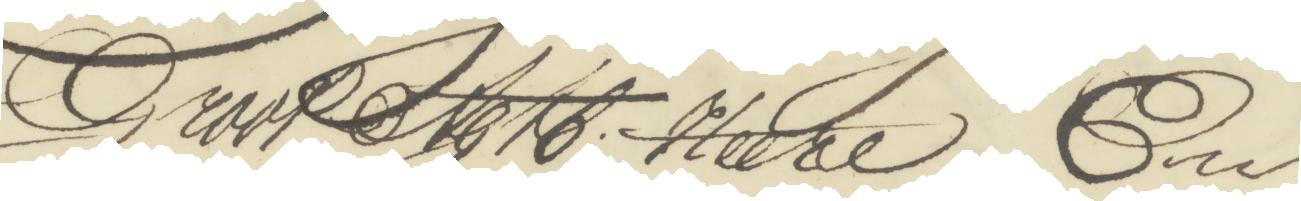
Groot Agtb: Heere En
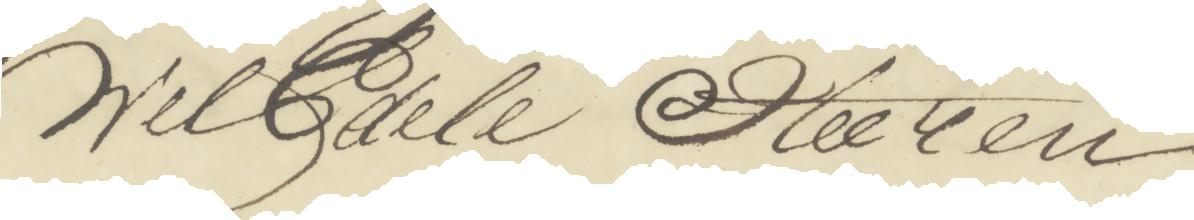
welEdele Heeren
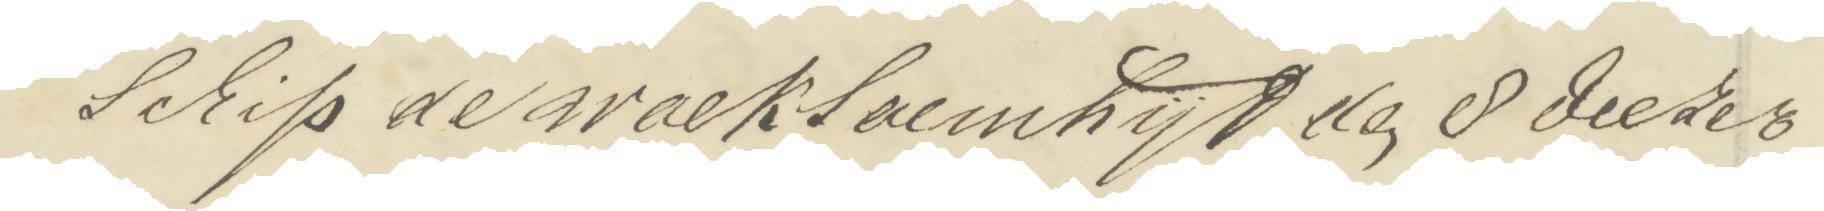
schip de waeksaemhijt den 8 deezen
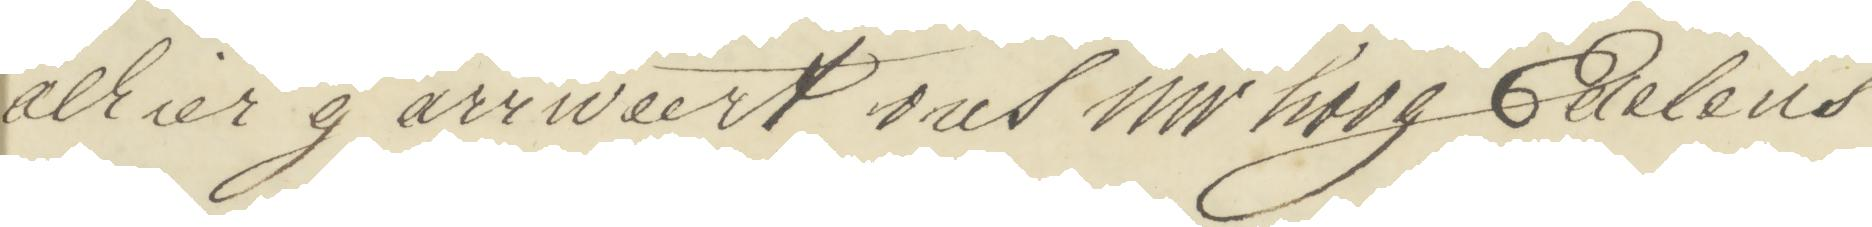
alhier g’arriveert dus uw hoog Edelens
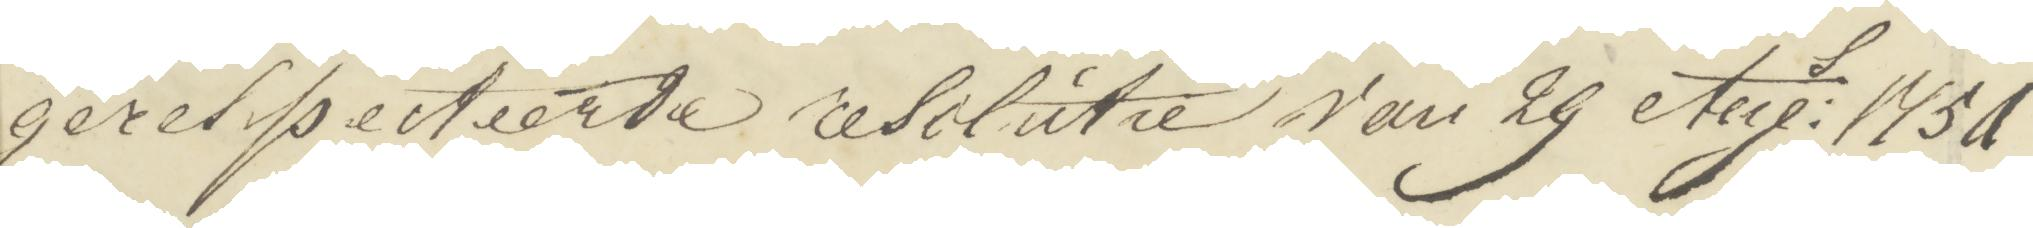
gerespecteerde resolutie van 29 Aug:s 1754
